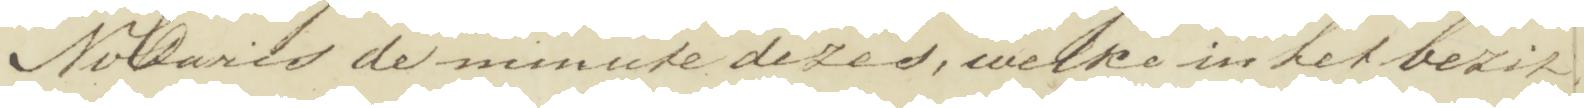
Notaris de minute dezes, welke in het bezit
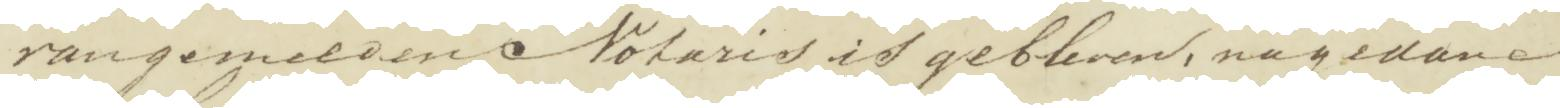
van gemelden Notaris is gebleven, na gedane
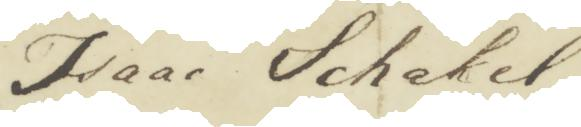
Isaac Schakel
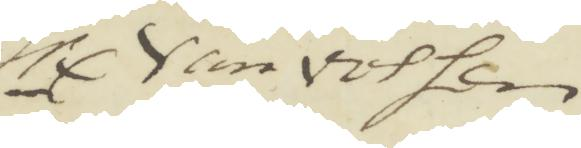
JHk van vossen
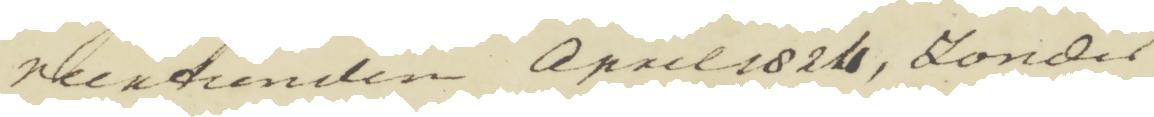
veertienden April 1824, zonder
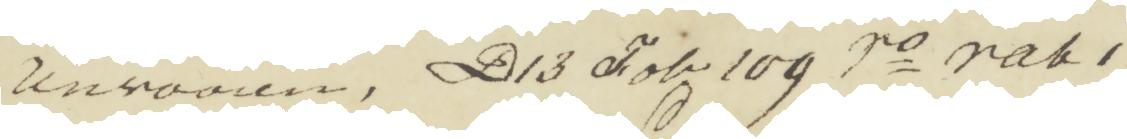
renvooien, D13 Fol,o 109 v=o vak 1
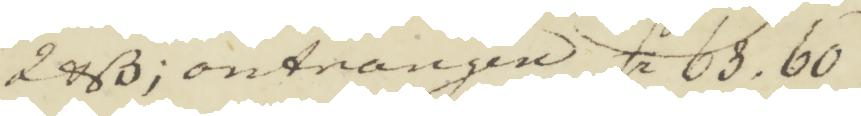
2 & 3; ontvangen ƒ 63.60
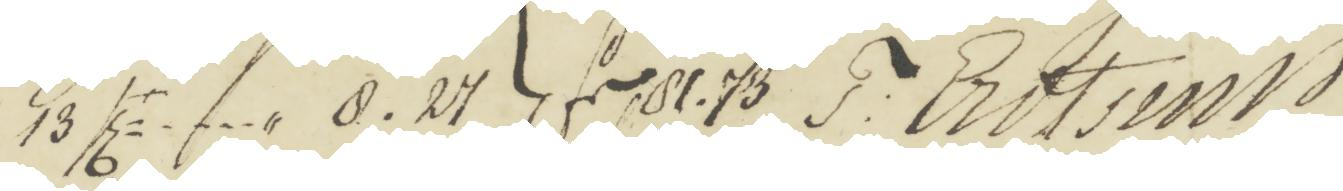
13 /c=t. _ _ _ „ - „ 8.27 ƒ 81.73 T: Erdtsieck
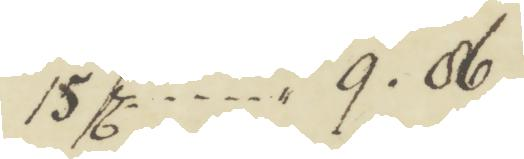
15 /c=t - - - - „ 9.86
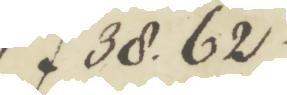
ƒ 38.62
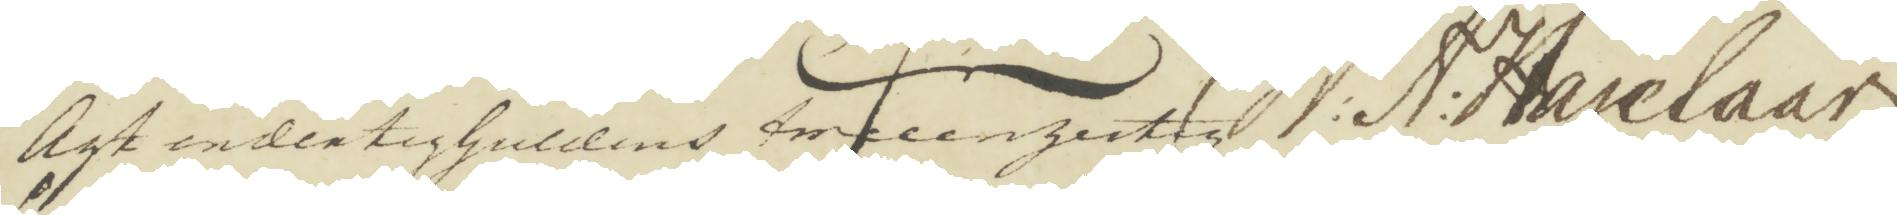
Agt endertig Guldens tweeenzestig W: A: Haselaar
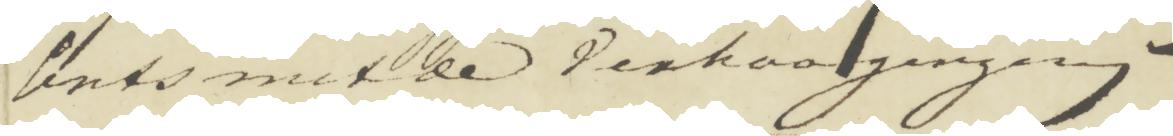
Cents met de Verhoogingen
